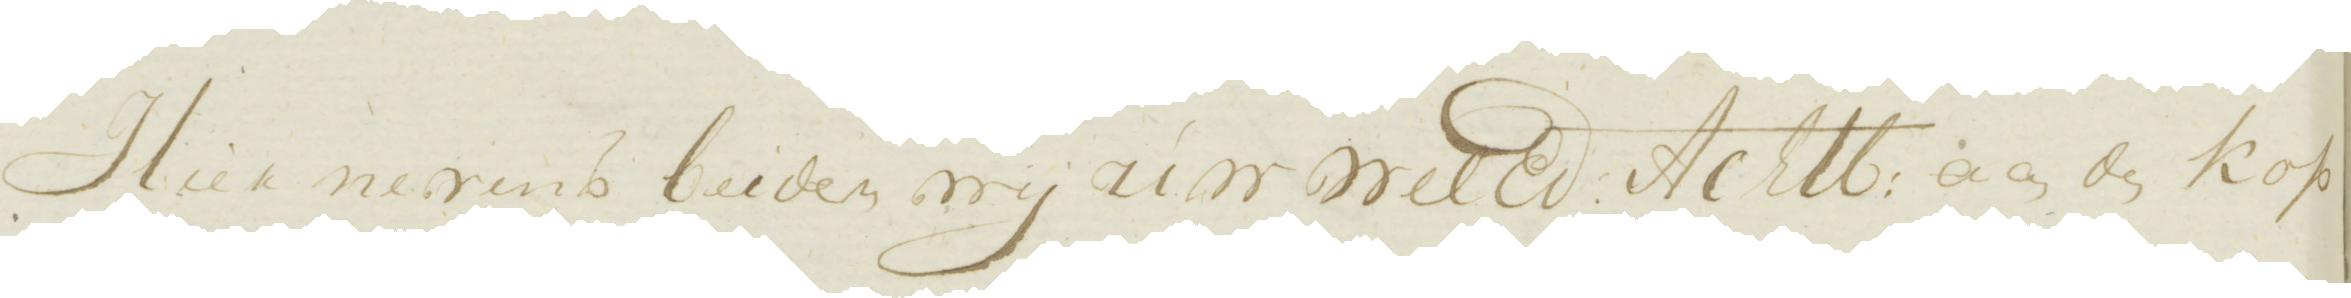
Hier nevens beiden wij uw wel Ed: Achtb: aan den kop
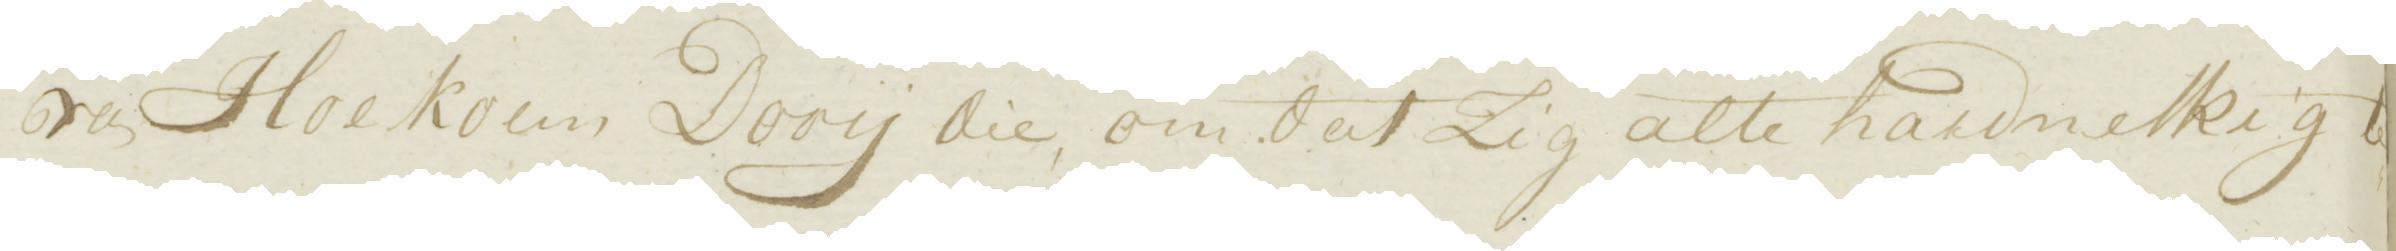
van Hoekoem Dooij die, om dat zig alte hardnekkig t
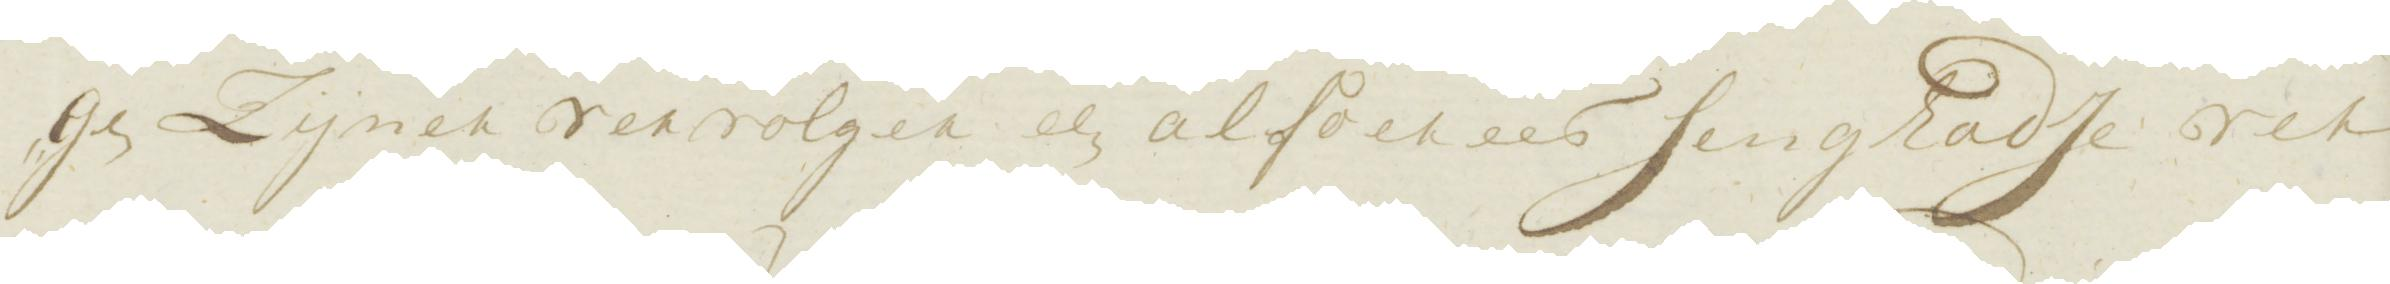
„gen zijner vervolger een alfoerees senghadje ver
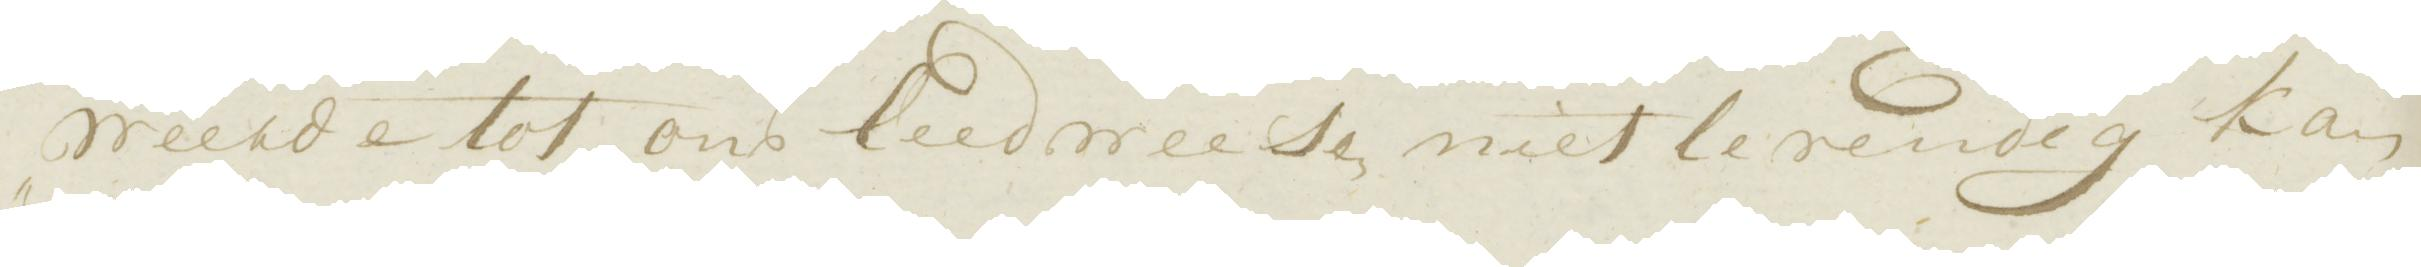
„weerde tot ons leedweesen niet levendig kan
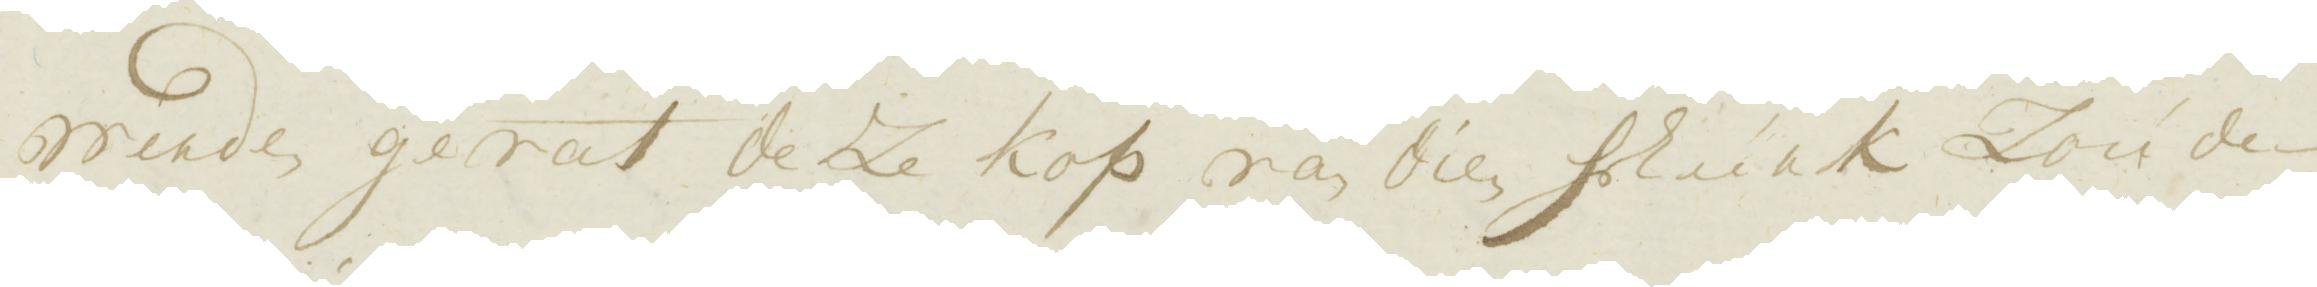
werden gevat deze kop van dien schurk zoude
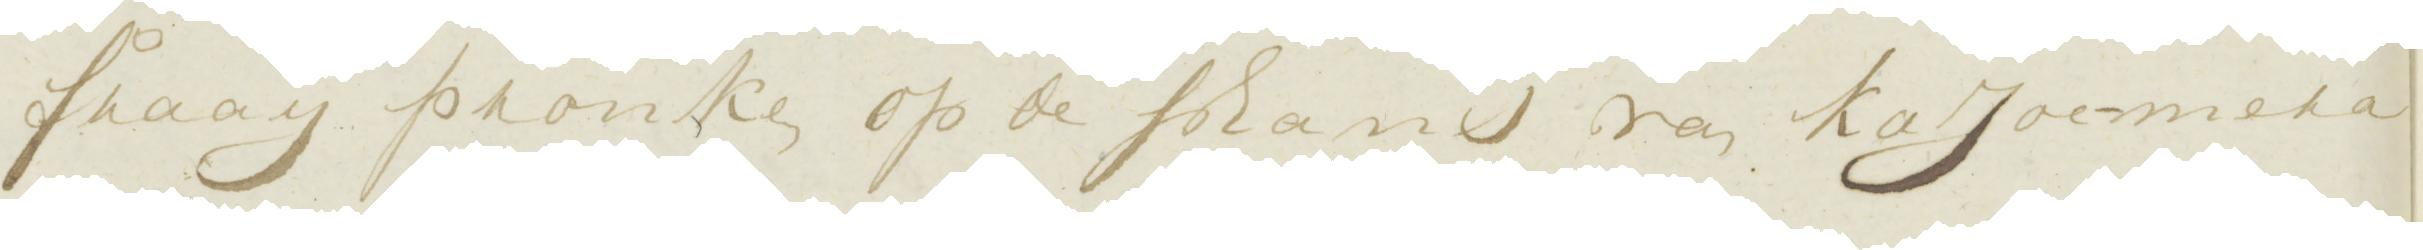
fraaij pronken op de schans van kajoemera
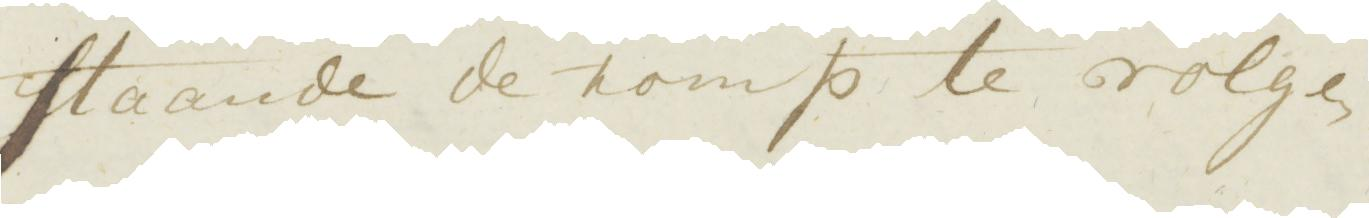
staande de romp te volgen
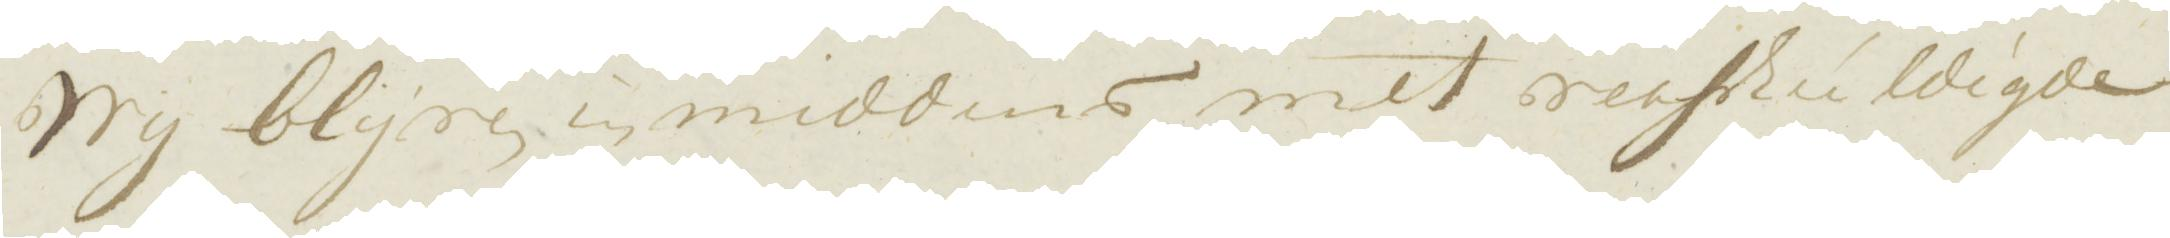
Wij blijven in middens met verschuldigde
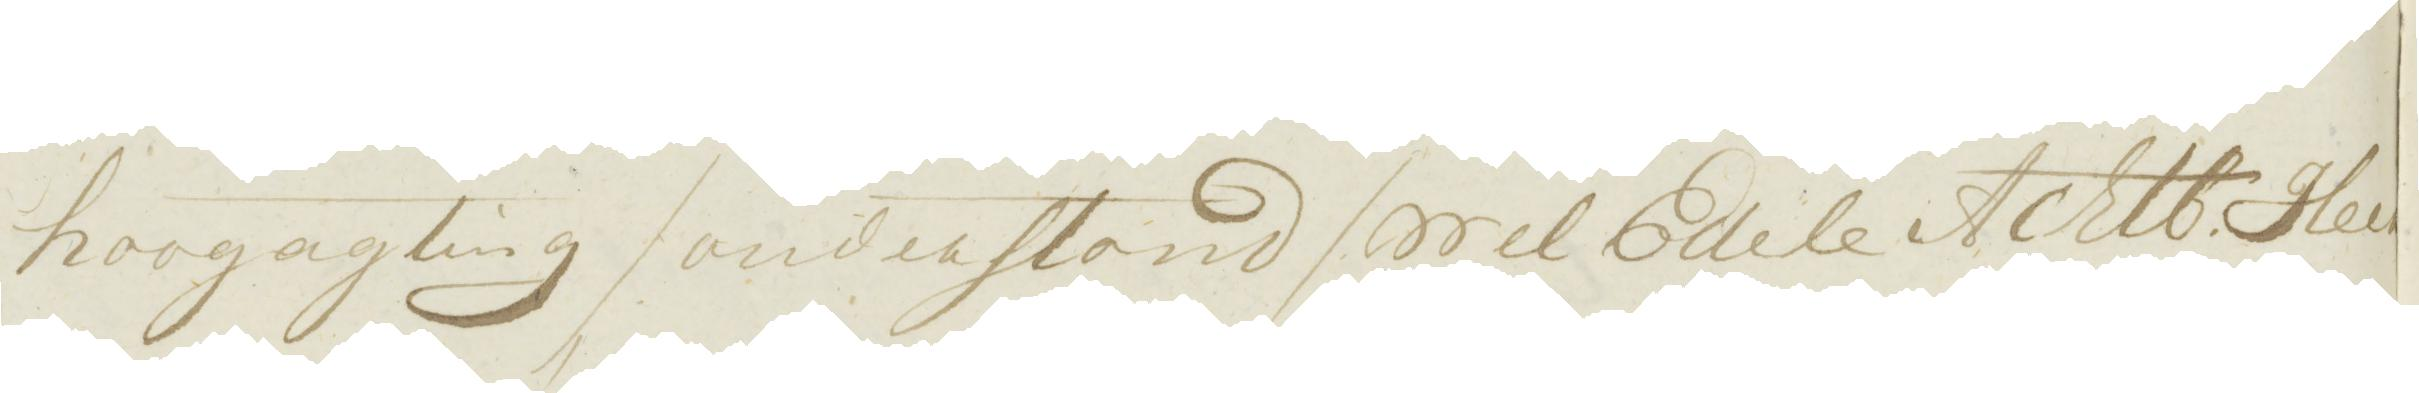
hoogagting /onderstond/ wel Edele Achtb: Hee
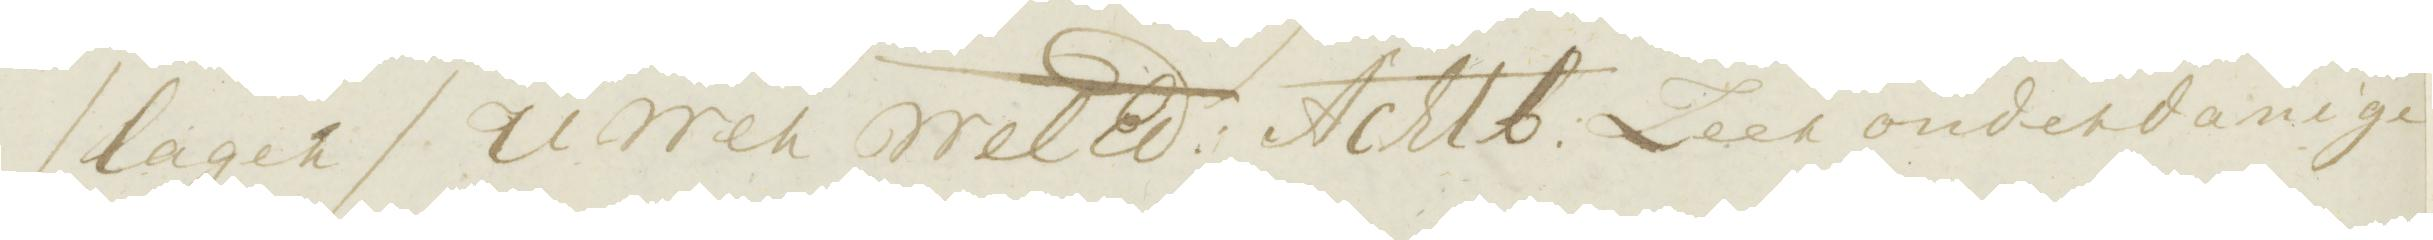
/lager /: uwer wel Ed: Achtb: Zeer onderdanige
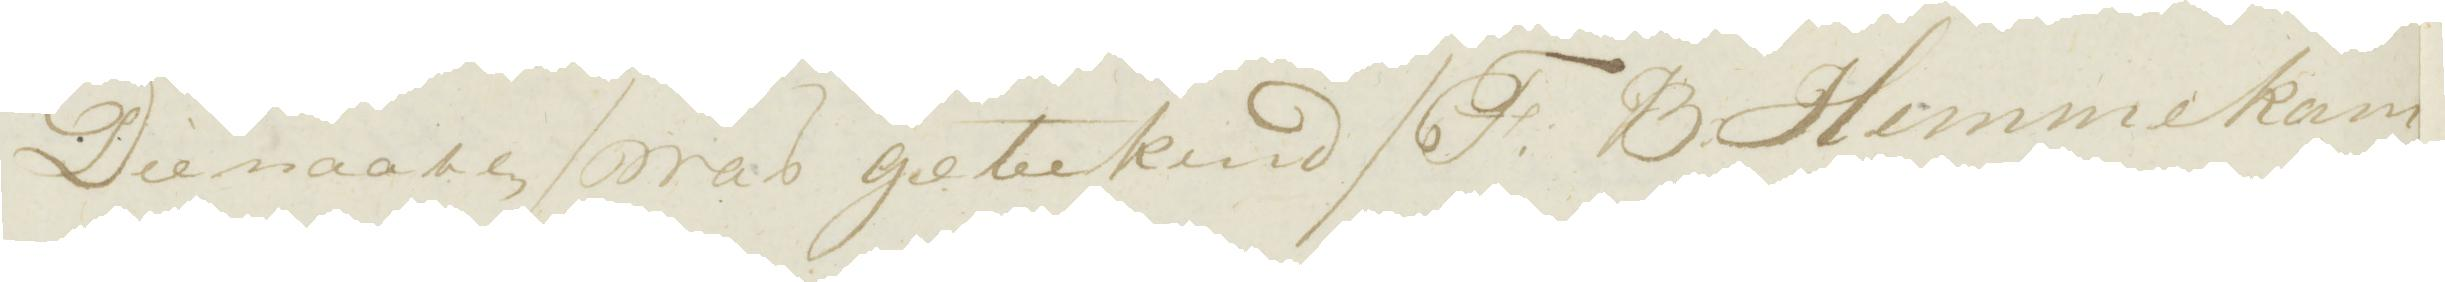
Dienaaren / was geteekend:/ F: B: Hemmekam
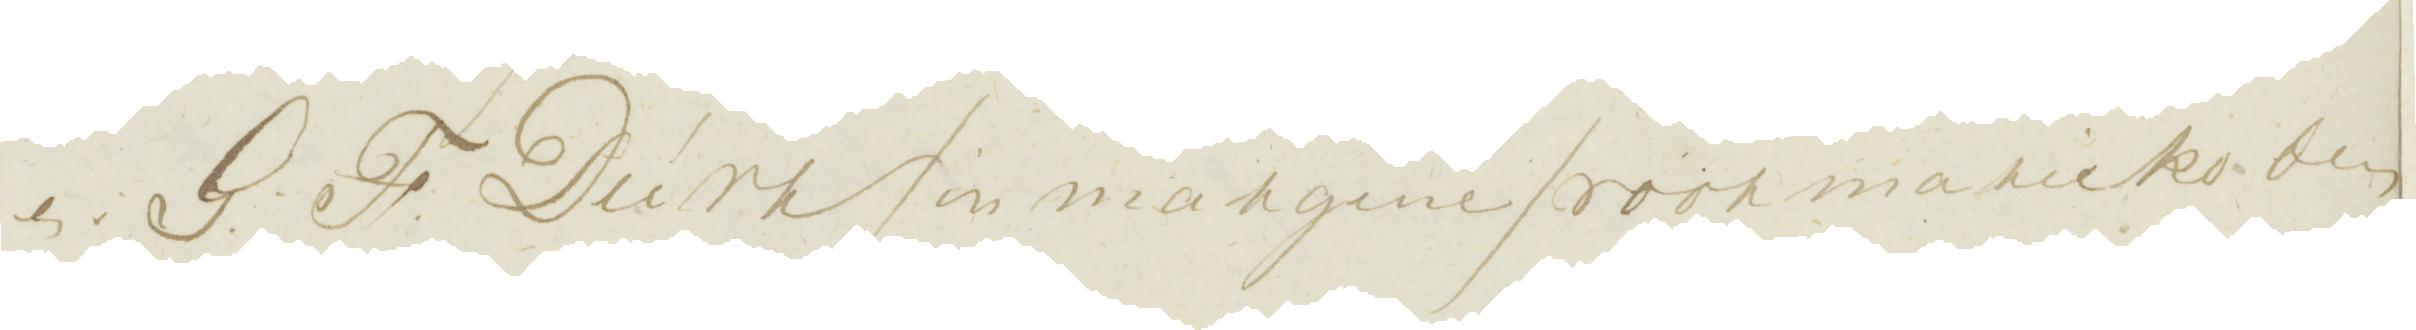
en. G: F: Durr / in margine /voor marieko den
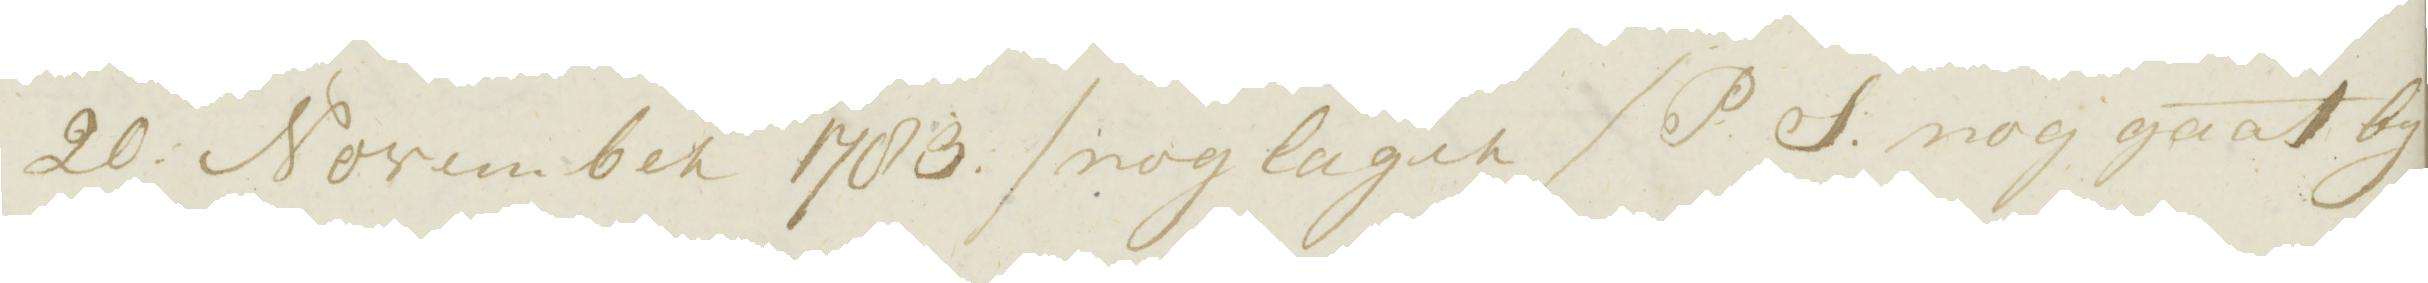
20: November 1783: /nog lager / P: S: nog gaat by
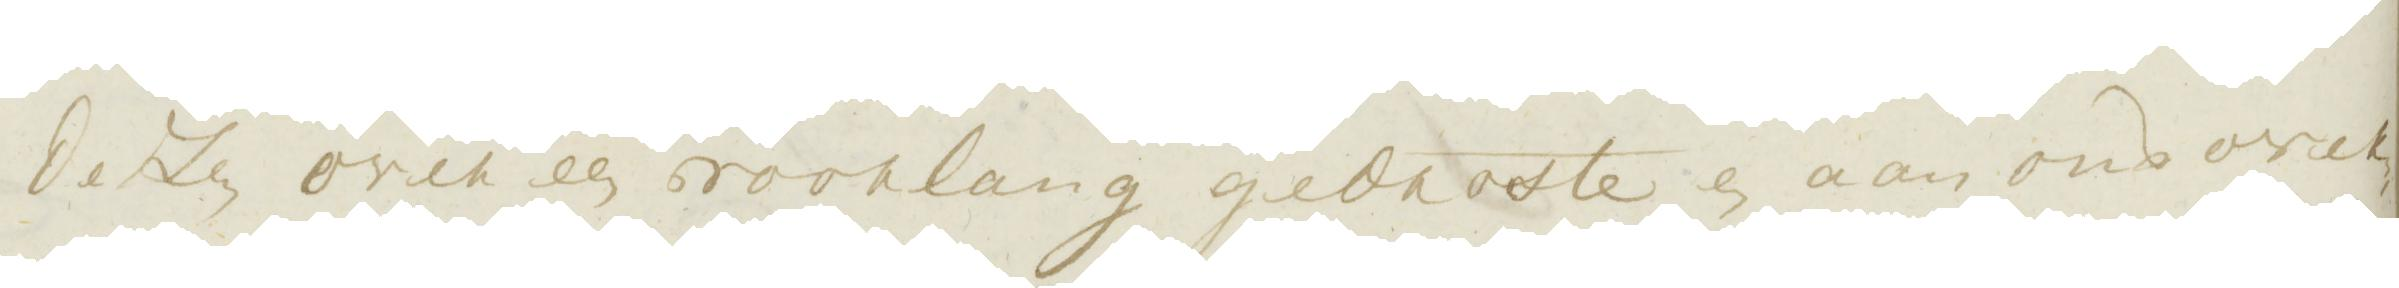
dezen over een voorlang gedroste en aan ons over
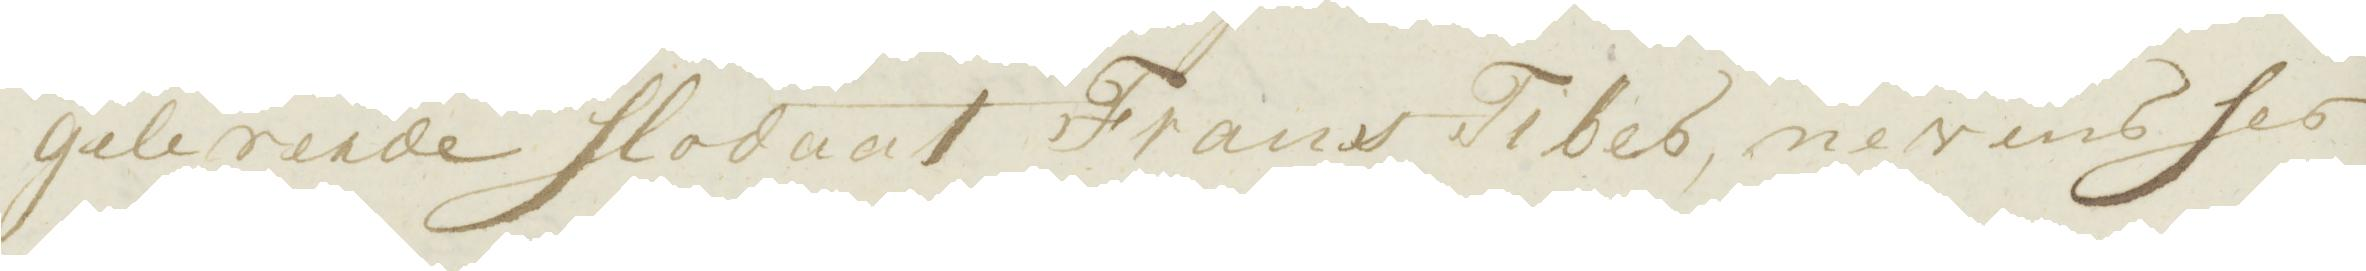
geleverde slodaat Frans Tibes, nevens ses
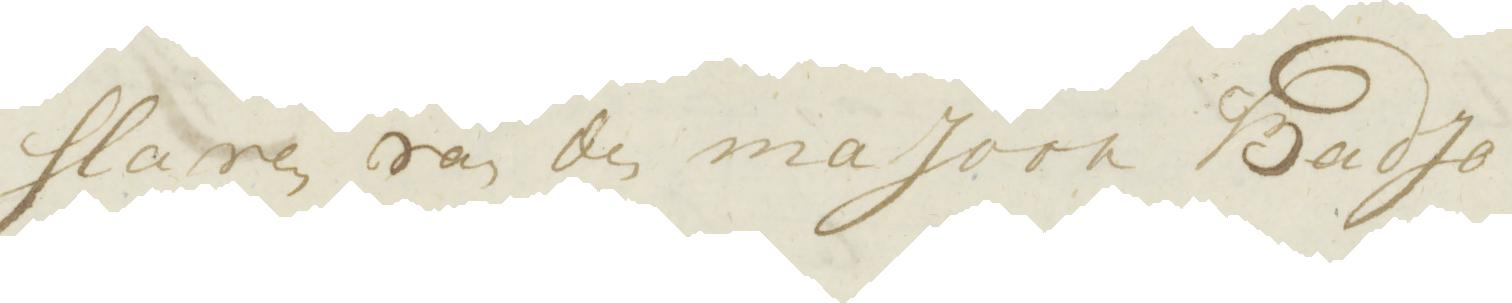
slaven van den majoor Badjo
